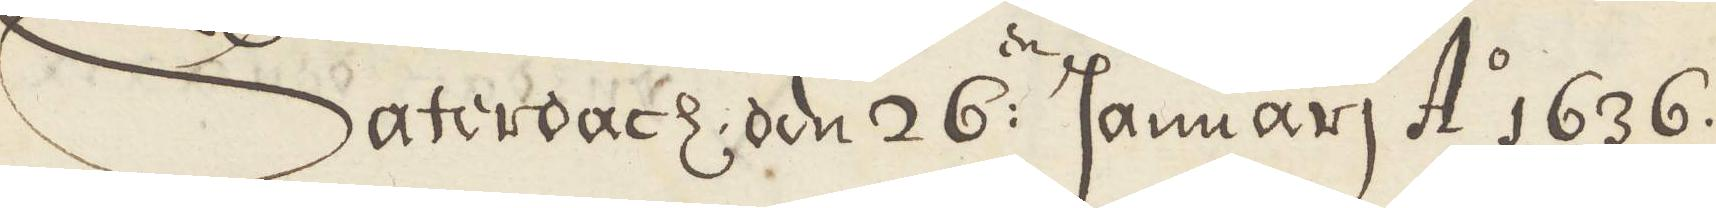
Saterdach den 26:en Januarj Ao 1636
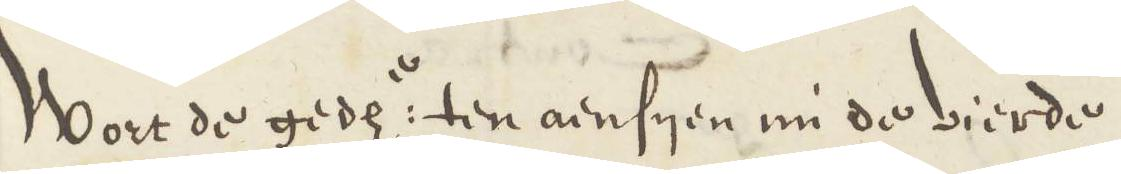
Wort de gedh:e ten aensyen in de vierde
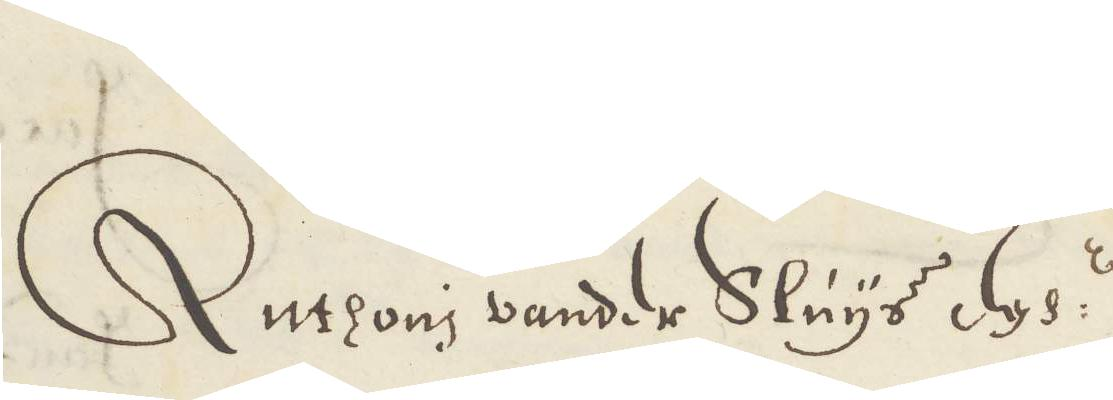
Anthonj van den Sluijs eys:r
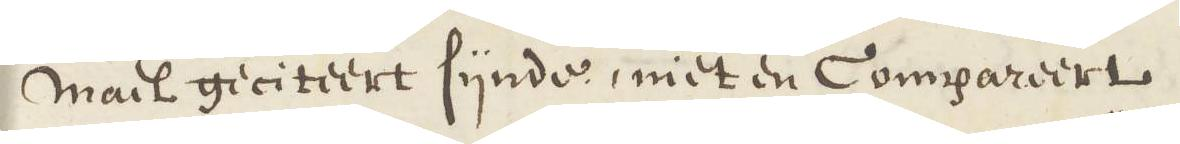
mael geciteert sijnde, niet en compareert
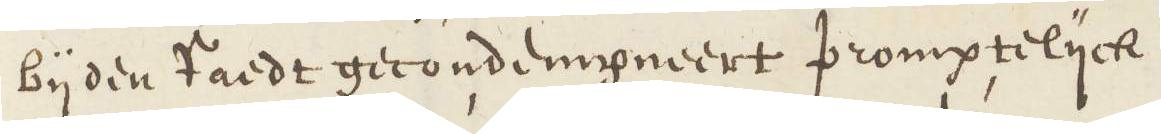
bij den Raedt gecondempneert promptelijck
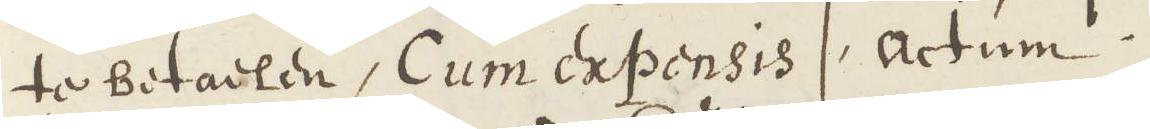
te betaelen, Cum expensis, actum
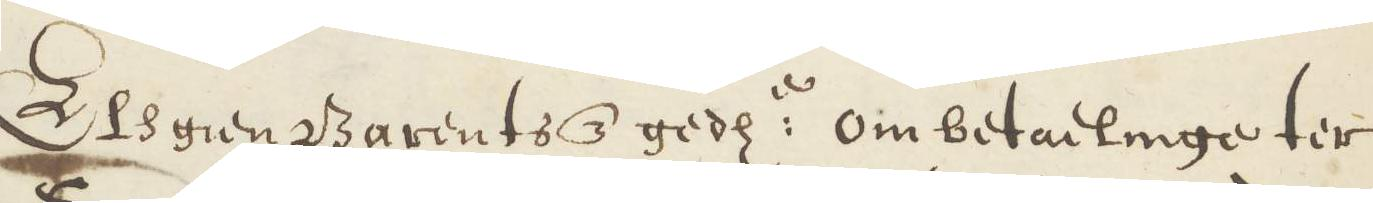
Elsgien Barents ende gedh:e om betaelinge ter
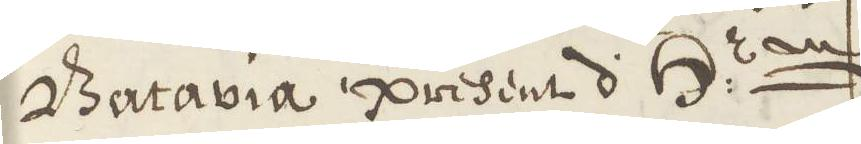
Batavia, present d’ H:r Gijsels
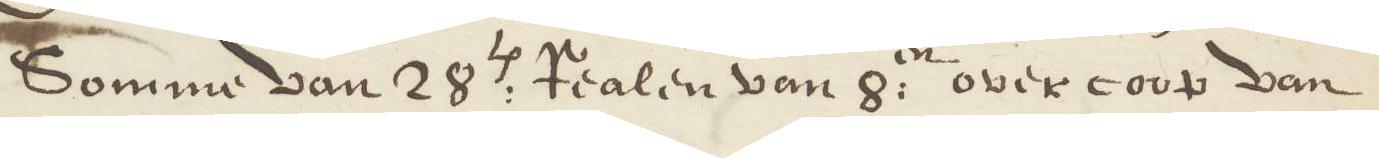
somme van 284: Realen van 8:en over coop van
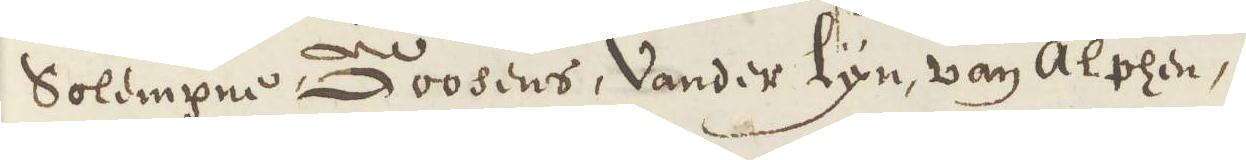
solempne Goosens, Vander Lijn, van Alphen,
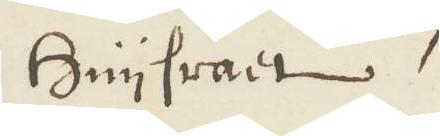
huijsraet
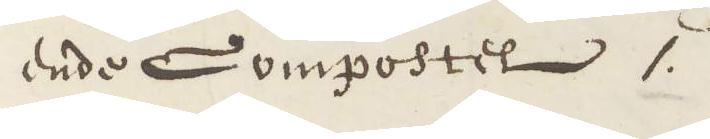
ende Compostel /.
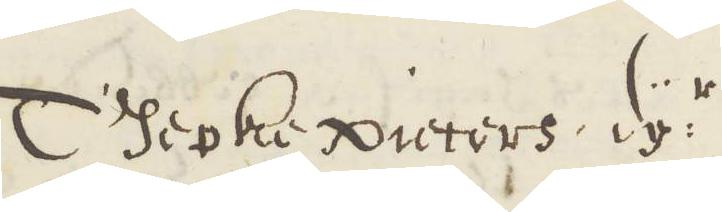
T'Iepke pieters, eij:r:
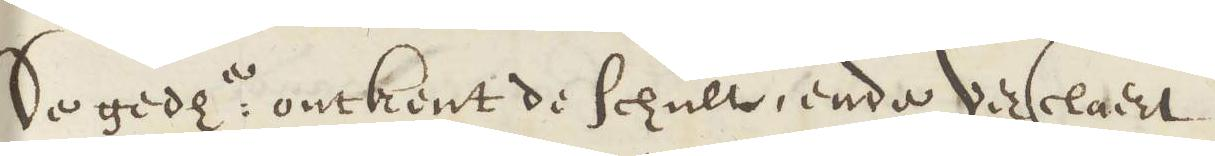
De gedh:e ontkent de schult, ende versclaert
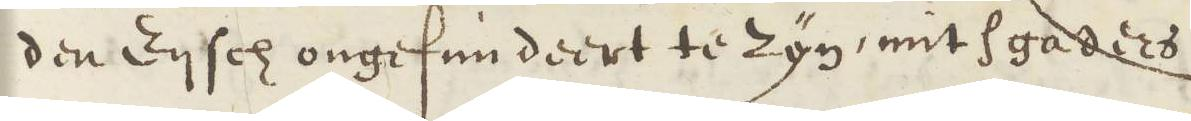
den Eysch ongefundeert te zijn, mitsgaders
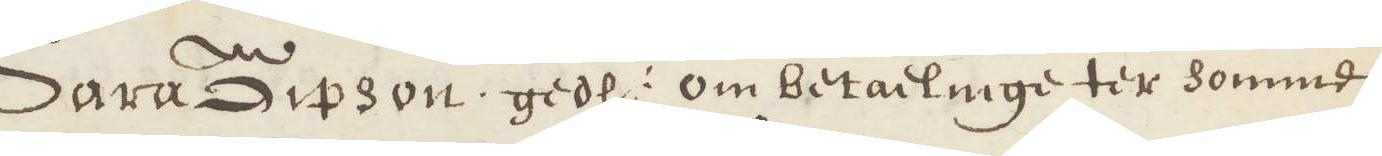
Sara Gipson. gedh:e om betaelinge ter somme
